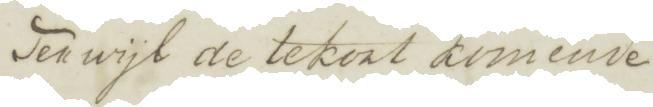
Terwijl de tekort komende
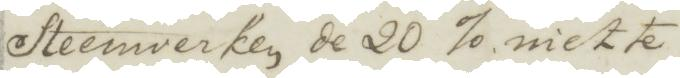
steenwerken de 20 % niet te
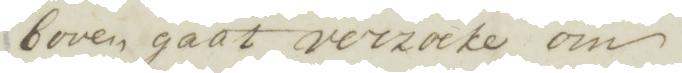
boven gaat verzoeke om
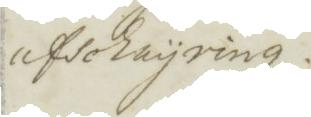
afschrijving.
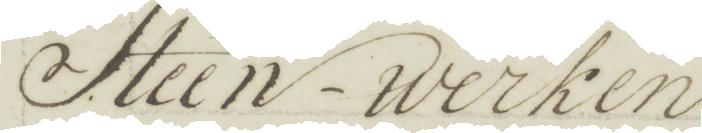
Steen - werken
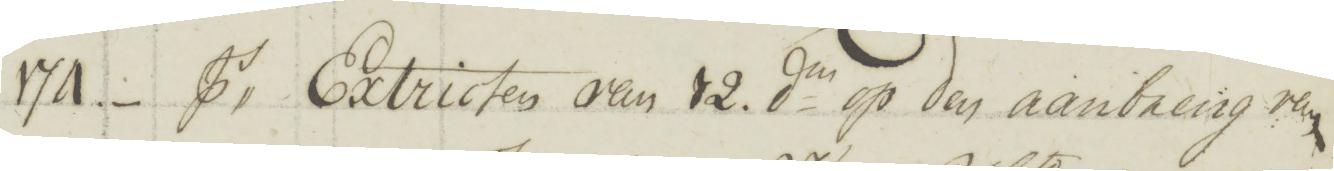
174._ p„s Extricten van 12. d=m op den aanbreng van
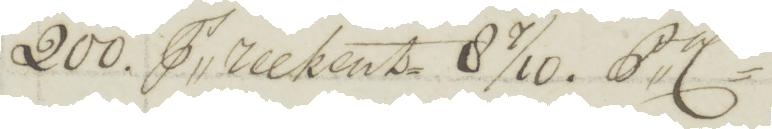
200. p„s reekent. 8 7/10. P„r c=to
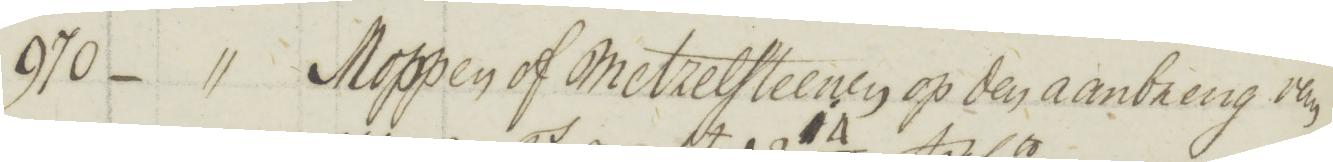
970 _ „ Moppen of Metzelsteenen op den aanbreng van
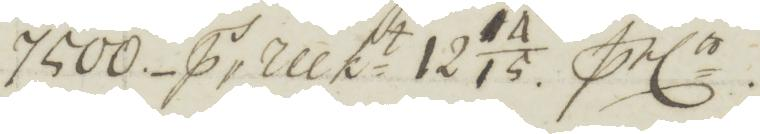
7500._ p„s reek=t 12 14/15. pr c=to.
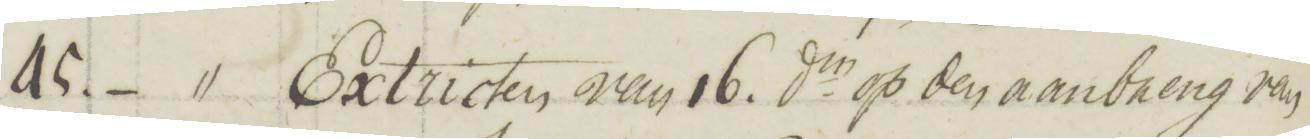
45._ „ Extricten van 16. d=m op den aanbreng van
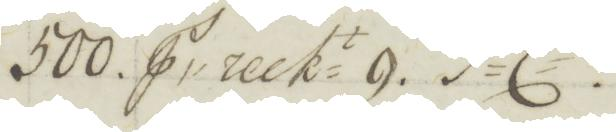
500. p„s reek:t 9. P=r c=to.
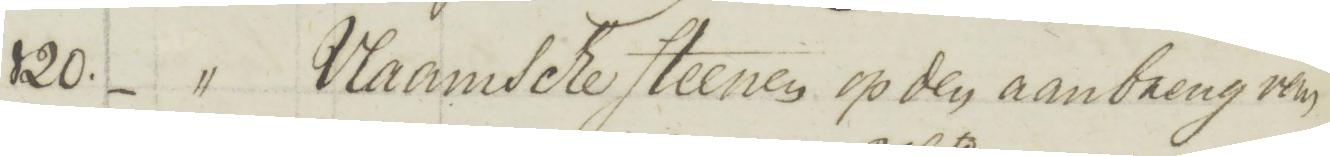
120.— „ Vlaamsche steenen op den aanbreng van
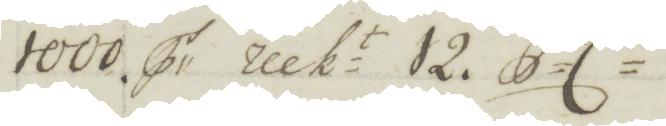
1000. p„s reek=t 12. p=r c=to
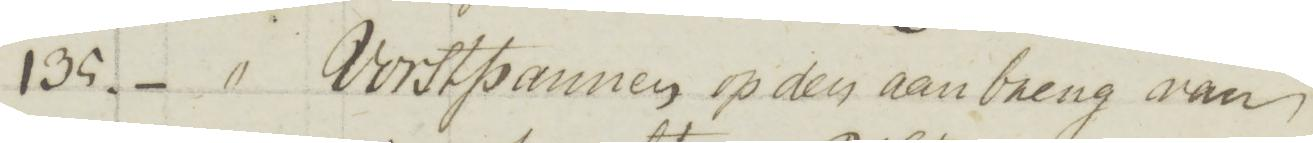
135.— „ Vorstpannen op den aanbreng van
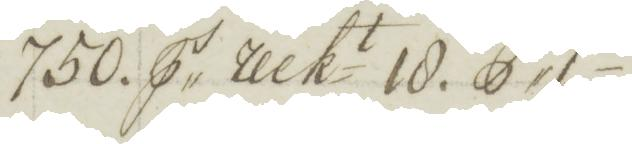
750. p„s reck=t 18. P„r c=to
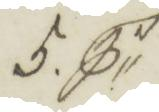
5. p„s
